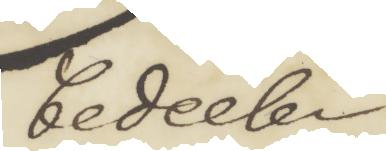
bedeelen
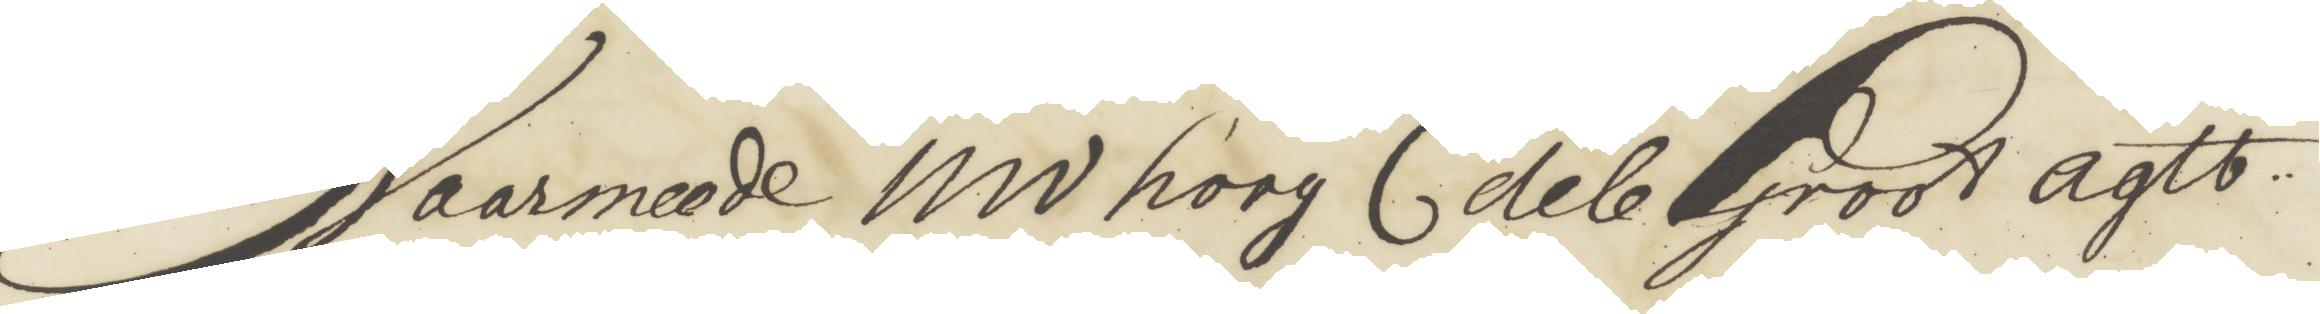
Waarmeede Uw hoog Edele Groot agtb
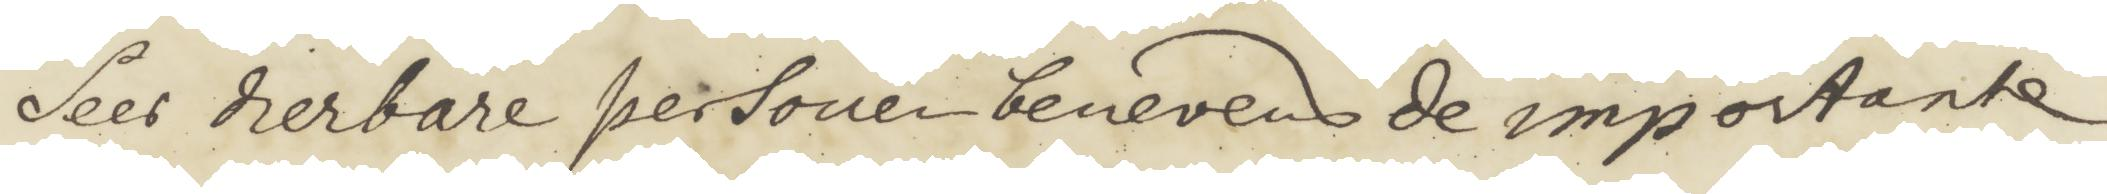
seer dierbare personen benevens de importante
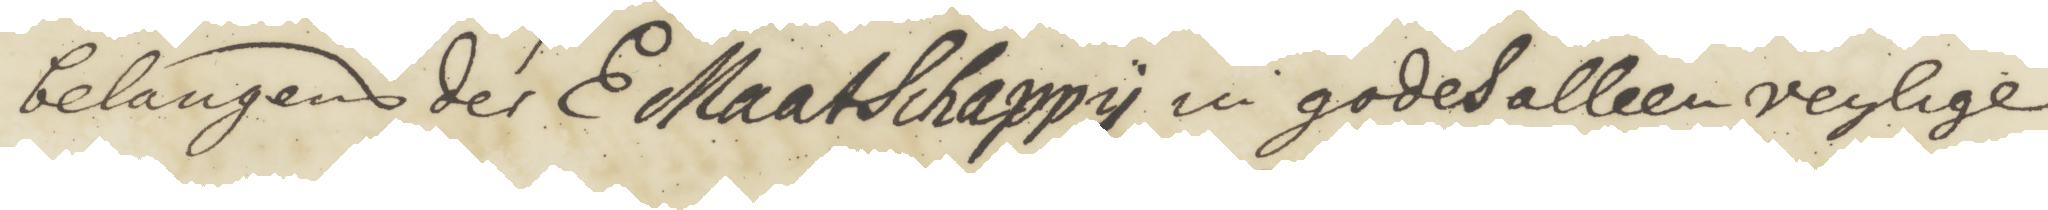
belangens der E Maatschappij in godes alleen veylige
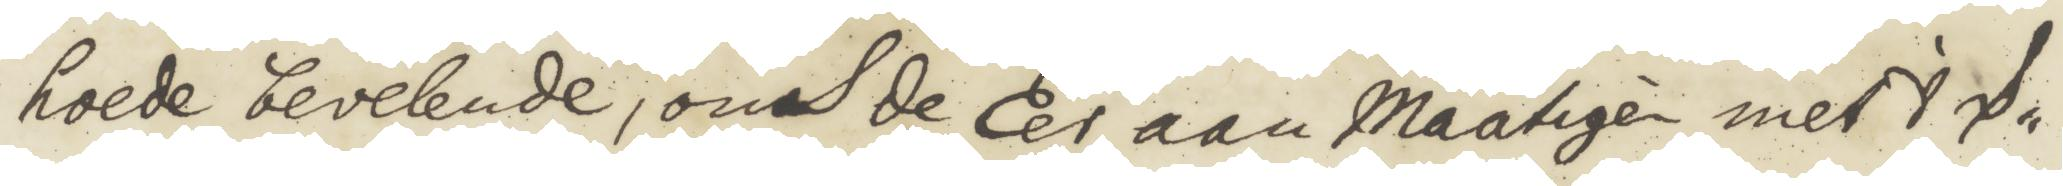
hoede bevelende; ons de Eer aan maatigen met t' ver„
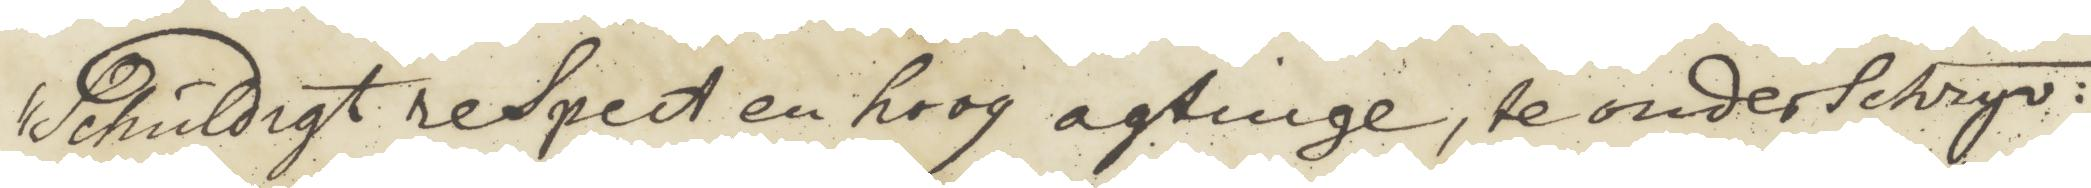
„schuldigt respect en hoog agtinge, te onderschryv:
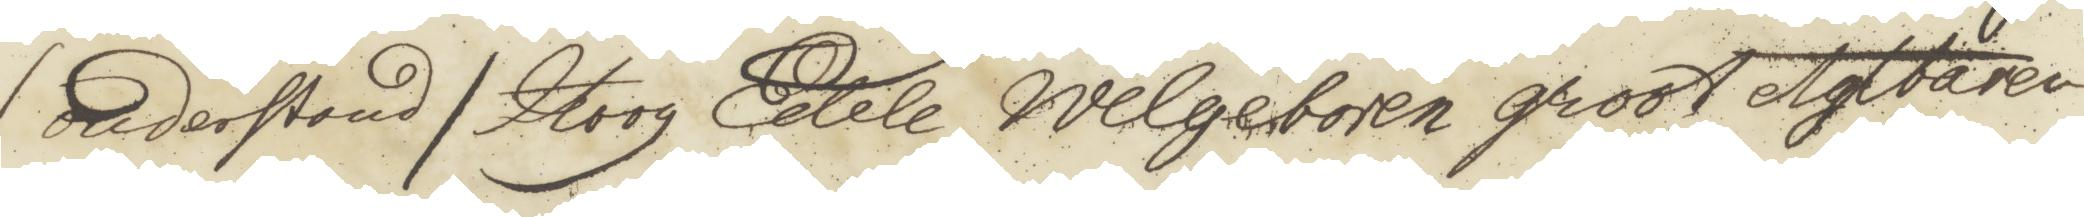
onderstond / Hoog Edele welgeboren groot Agtbaren
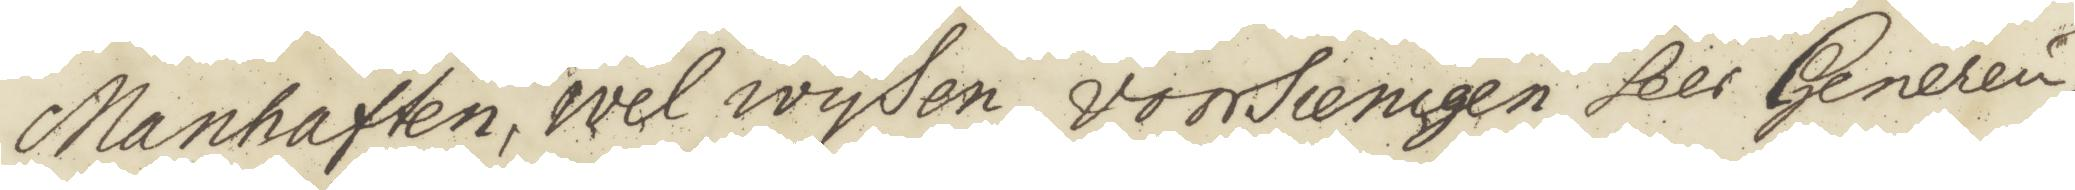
Manhaften, wel wysen voorsienigen seer Genereu
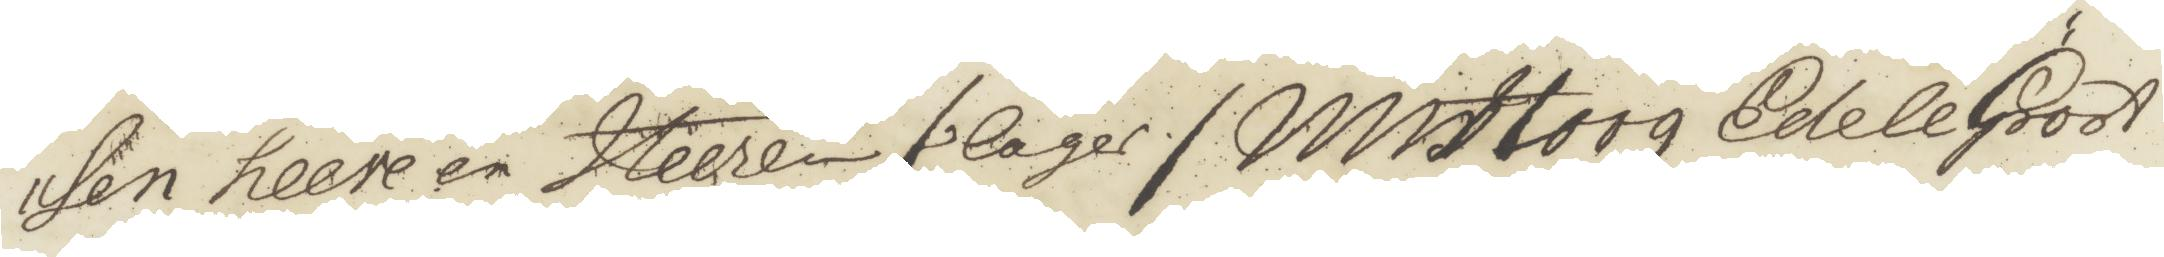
„sen heere en Heeren / lager / UW Hoog Edele Groot
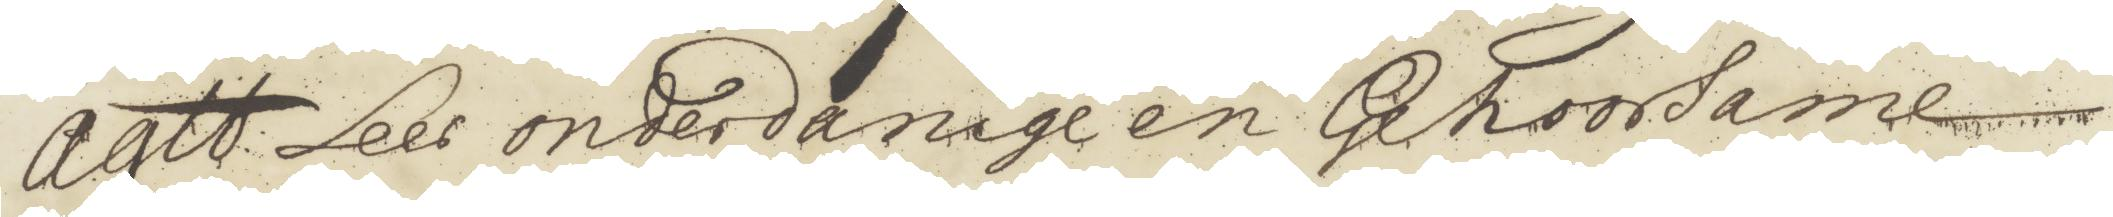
agtb seer onderdanige en Gehoorsame
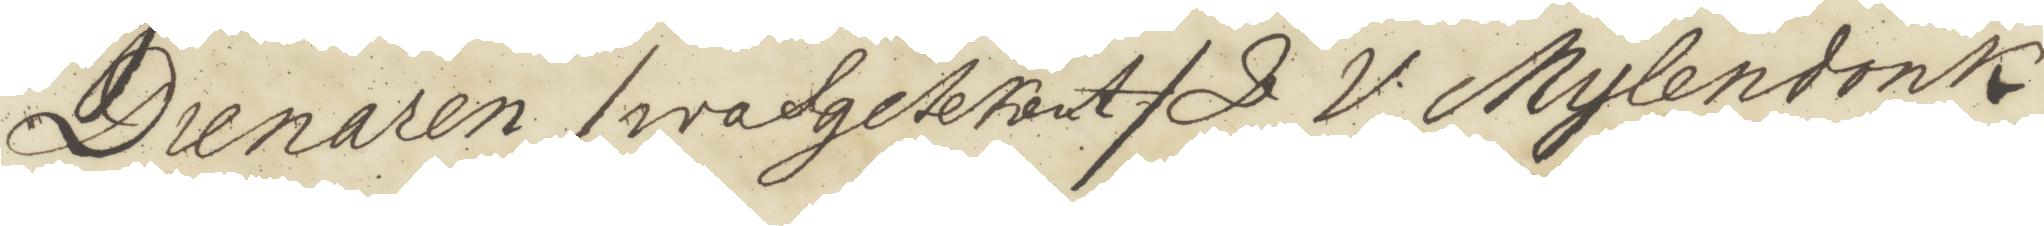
Dienaren / was getekent / I V Mylendonk
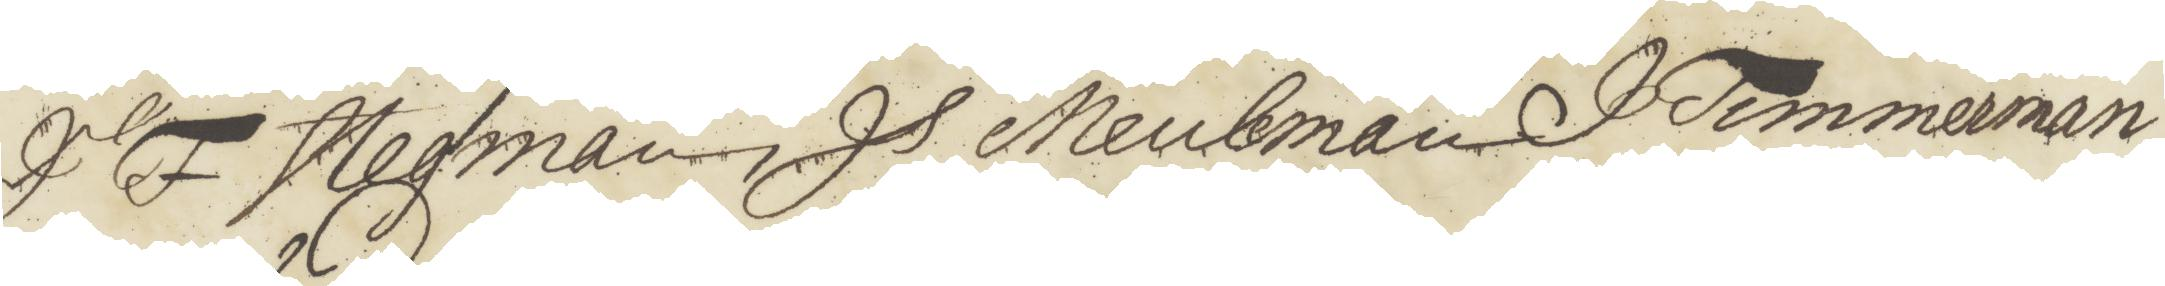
J F Stegman, Is Meuleman I Timmerman
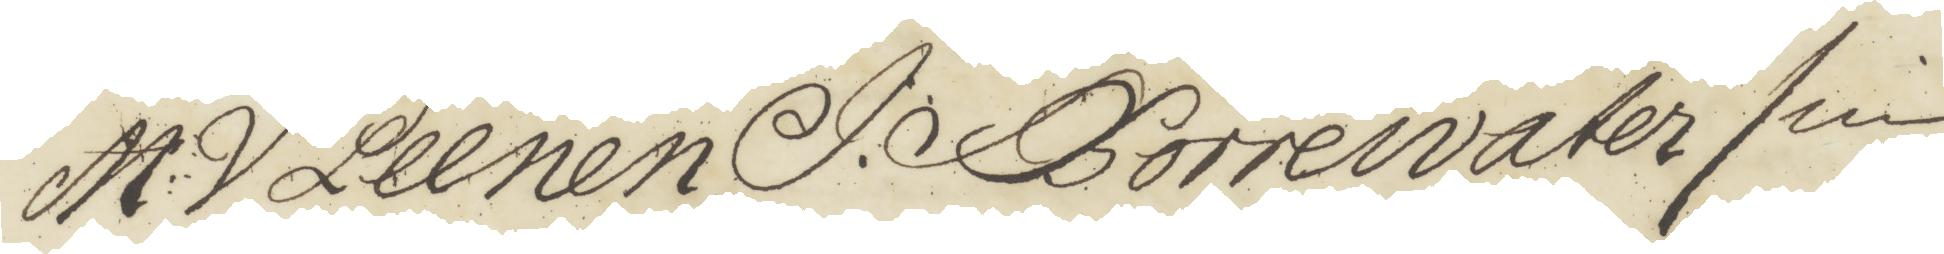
M: V Peenen I: Borrewater / in
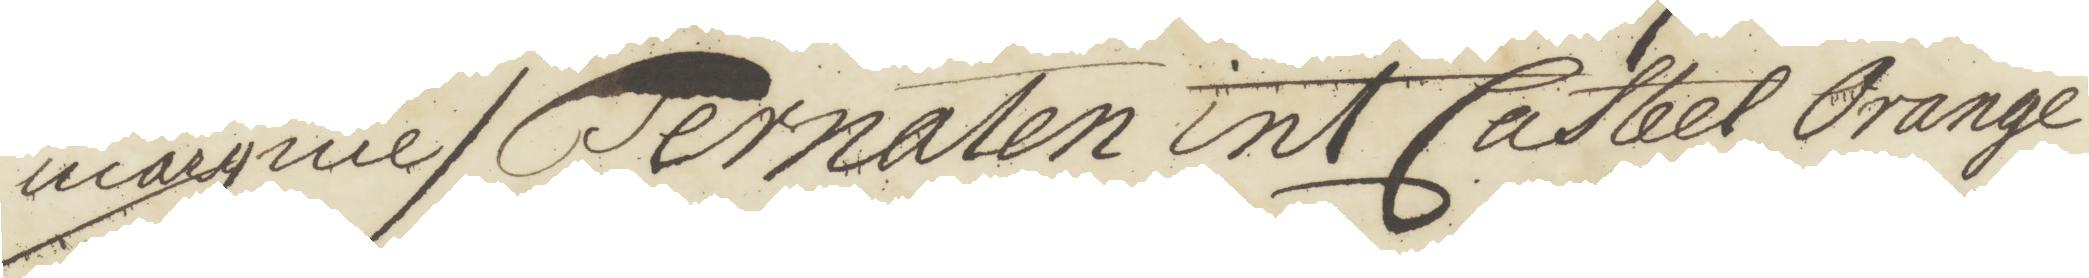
margine / Ternaten int Casteel Orange
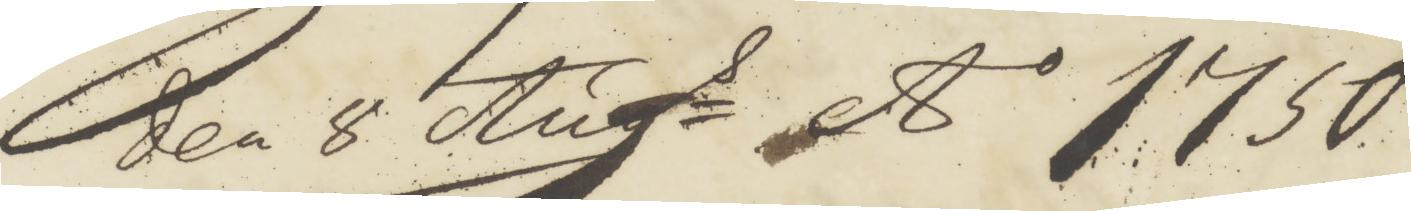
den 8 Aug=s Ao 1750
